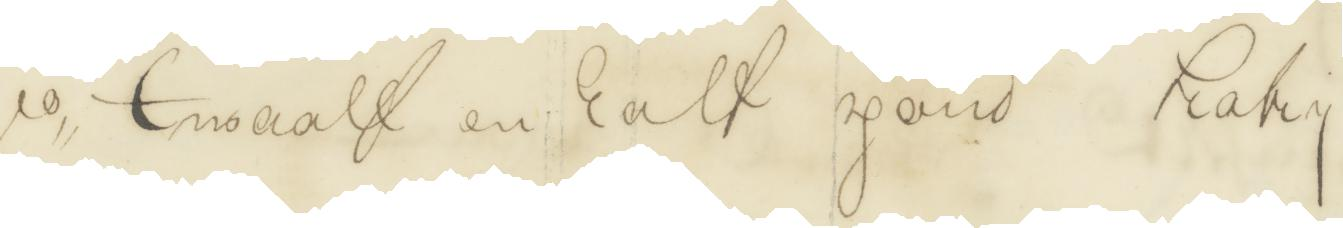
_„o twaalf en half pond kakij
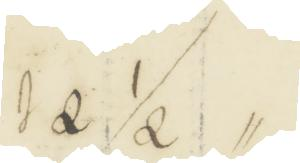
12½„
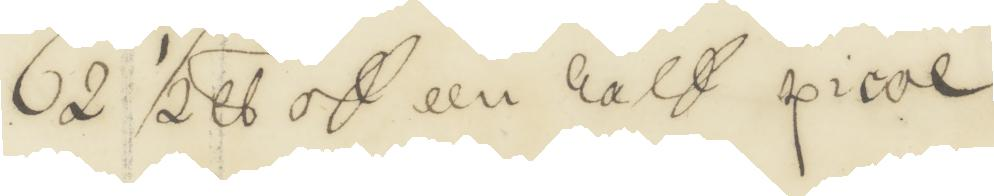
62½ lb of een half picol
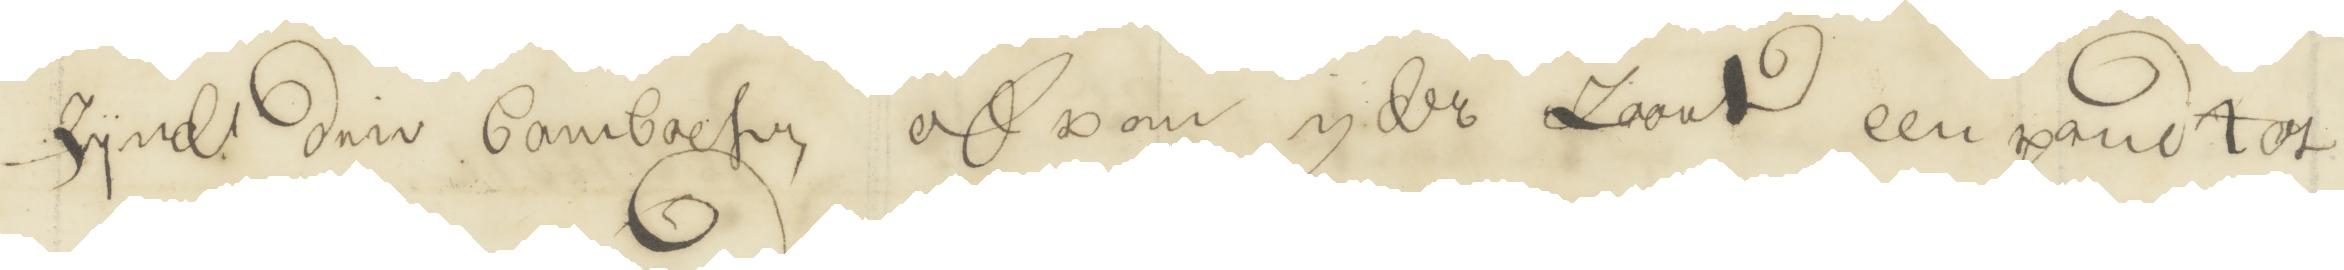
zijnde drie bamboesen af van ijder zoort een pand tot
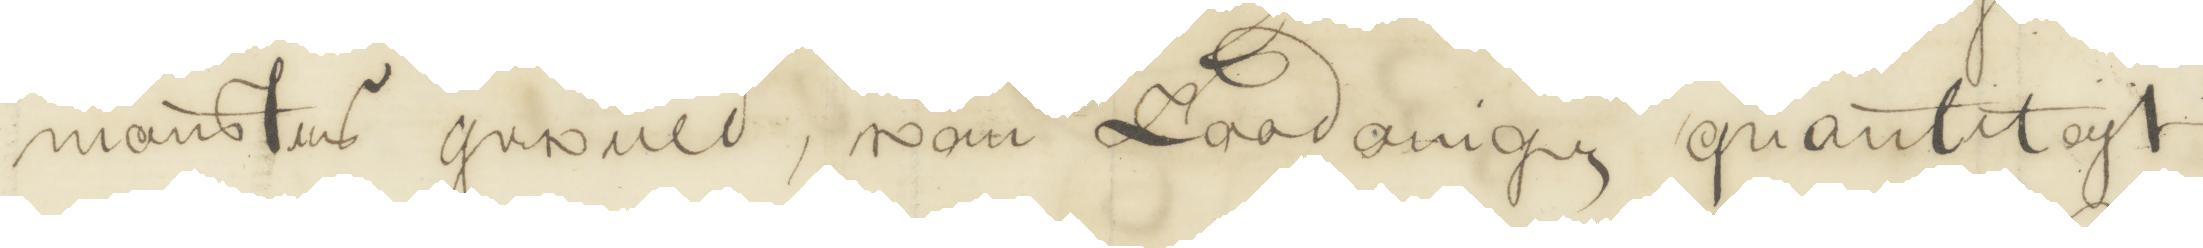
monster gesteld, van zoodanigen quantitijt
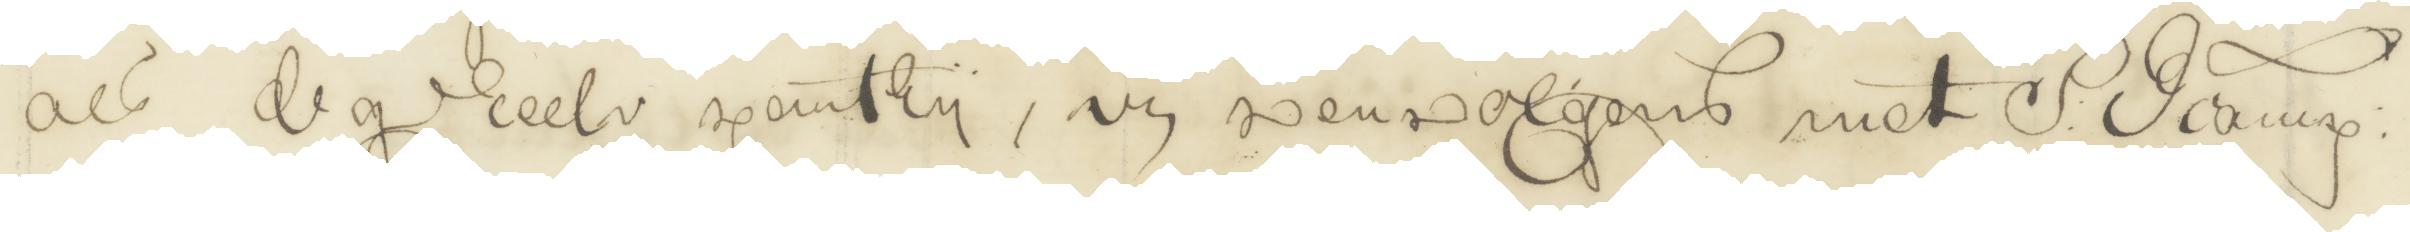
als de geheele parthij, en vervolgens met SEcomp:
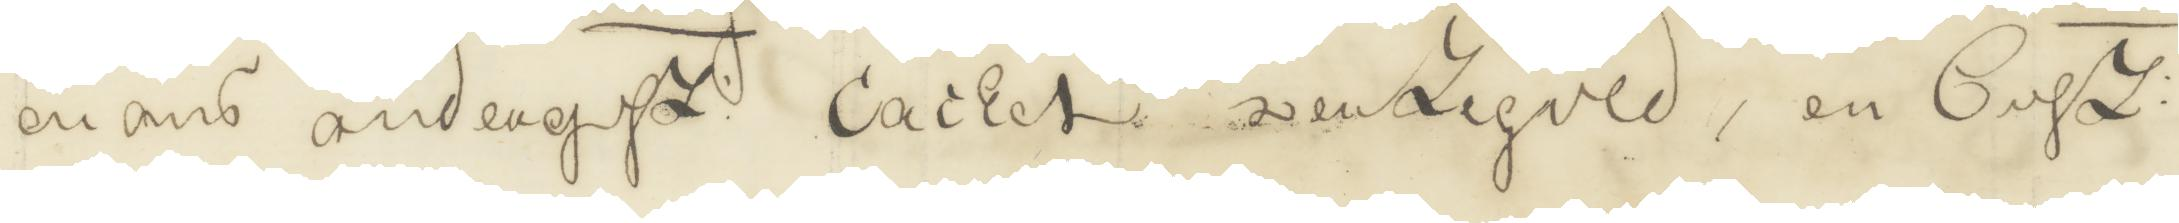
en ons ondergesz: cachet„ verzegeld, en besz:
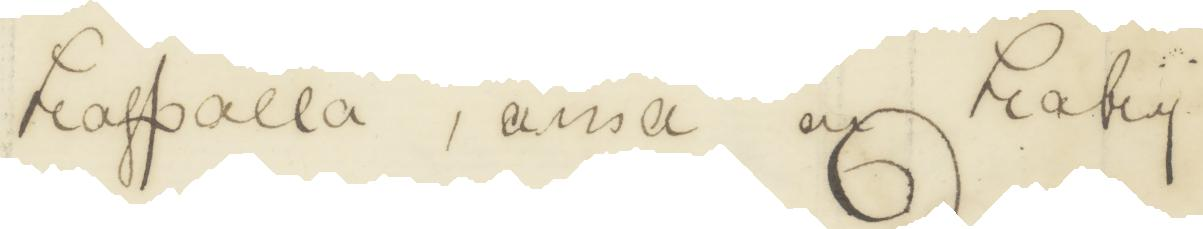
kappalla, awa en kakij
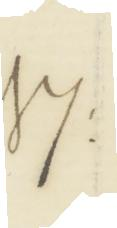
17:-:
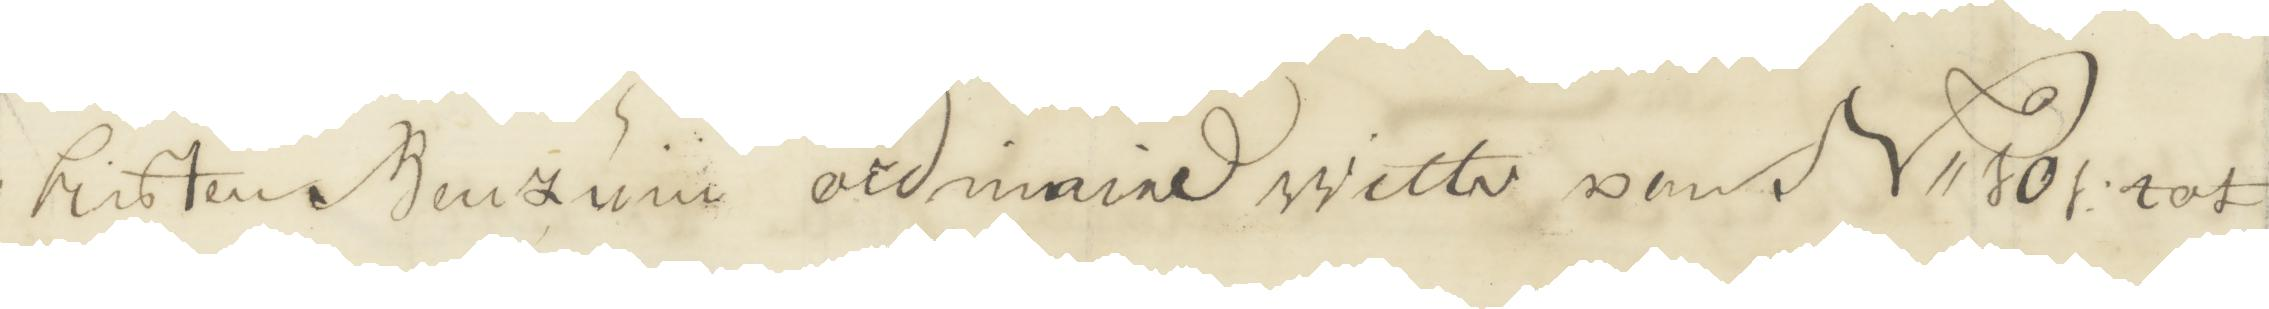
kisten Benzuin ordinaire witte van N„o 101: tot
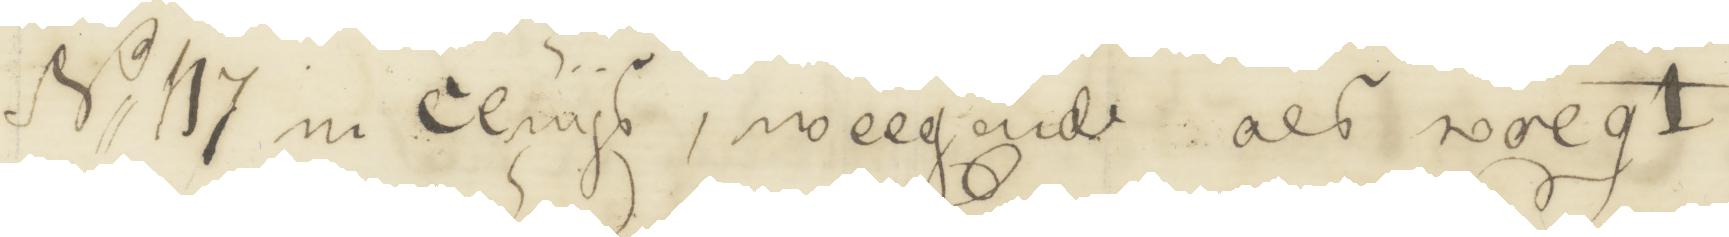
N:o 117 in cluijs, weegende als volgt
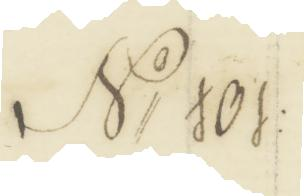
N„o 101
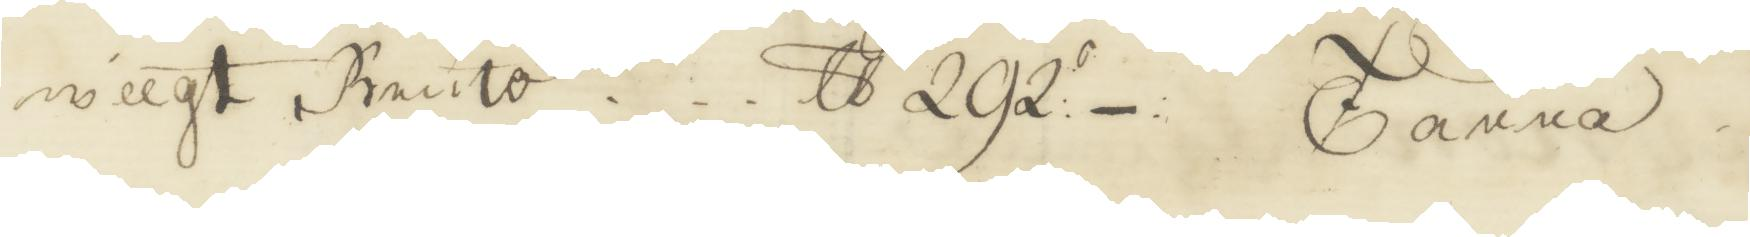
weegt Bruto - - . lb 292:s-: Tarra - .
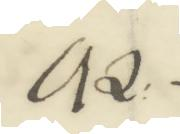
42:-:
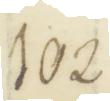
102
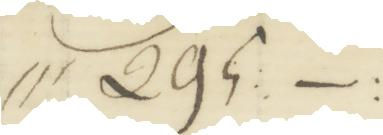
„ - - .„' 295:-:
